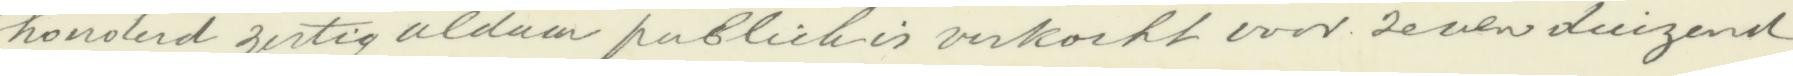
honderd zestig aldaar publiek is verkocht voor zeven duizend
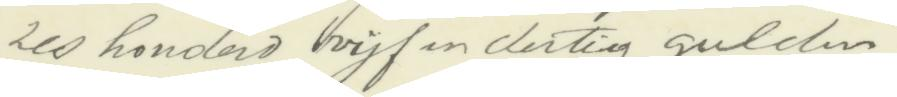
zes honderd vijf en dertig gulden
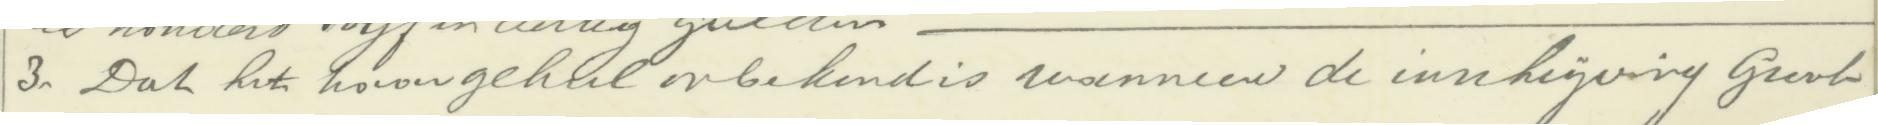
3. Dat het haar geheel onbekend is wanneer de inschrijving Groot
